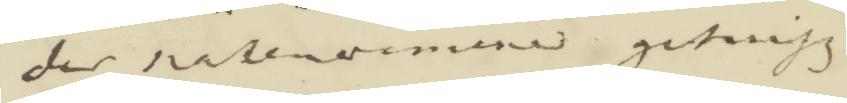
der natenoemene getuigen
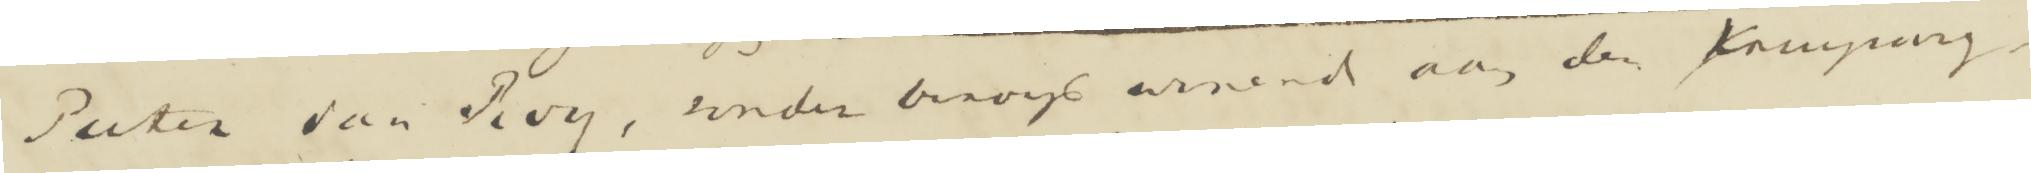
Pieter van Roij, zonder beroep wonend aan den Kruysweg
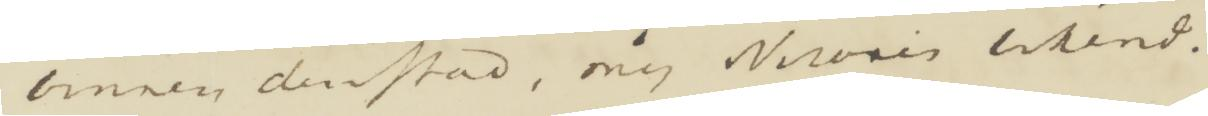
binnen den Stad, mij Notaris bekend.
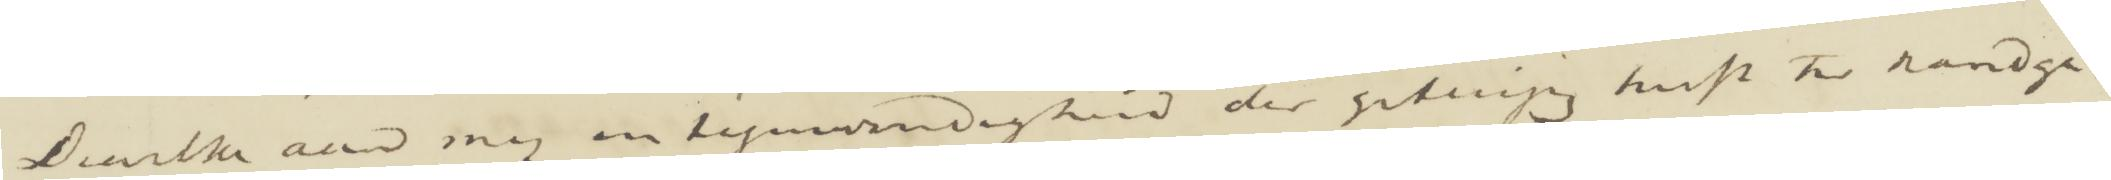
Dewelke aan mij in tegenwoordigheid der getuigen heeft te handge
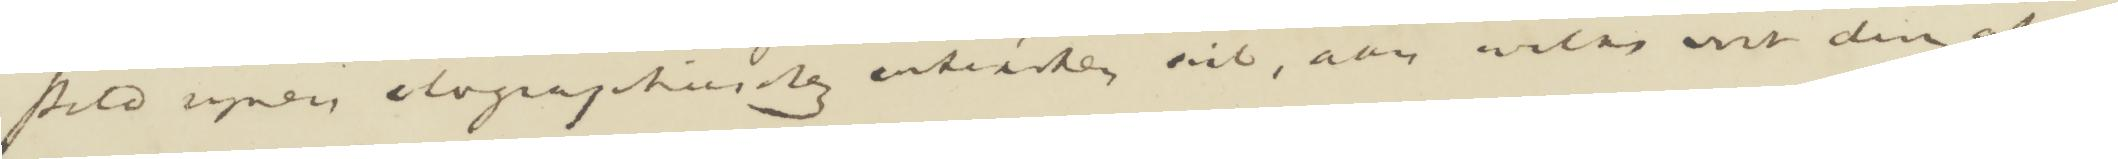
steld zijnen olographieschen uiterste wil, aan welke met dese akte
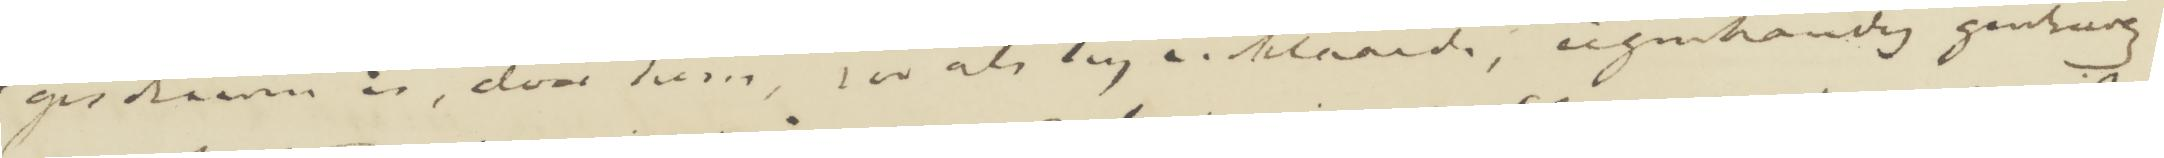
geschreven is, door hem, en als hij verklaarde, eigenhandig geschreeven
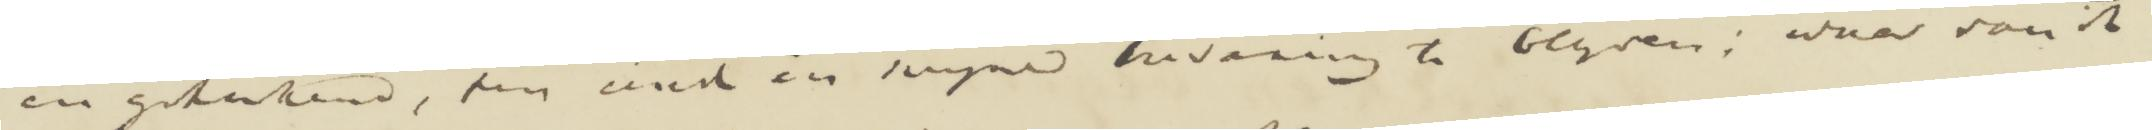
en geteekend, ten einde in mijne bewaring te blijven; waar van ik
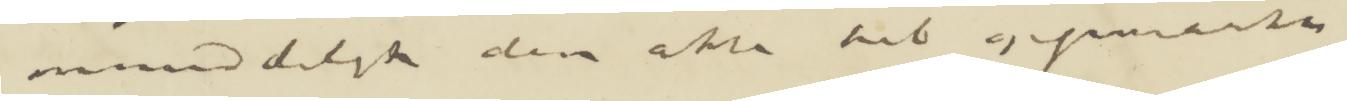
onmiddelijk den akte heb opgemaakt
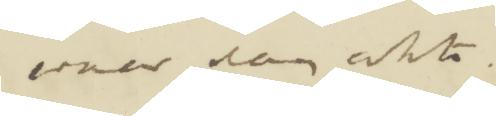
waar van akte.
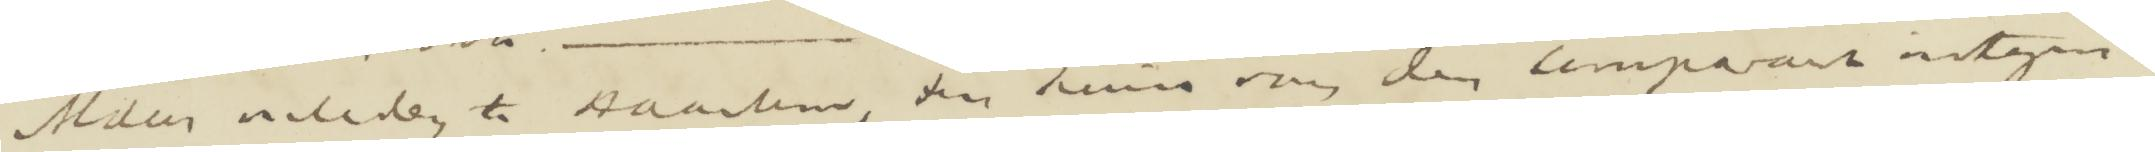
Heden verleden te Haarlem ten huise van den comparant integen-
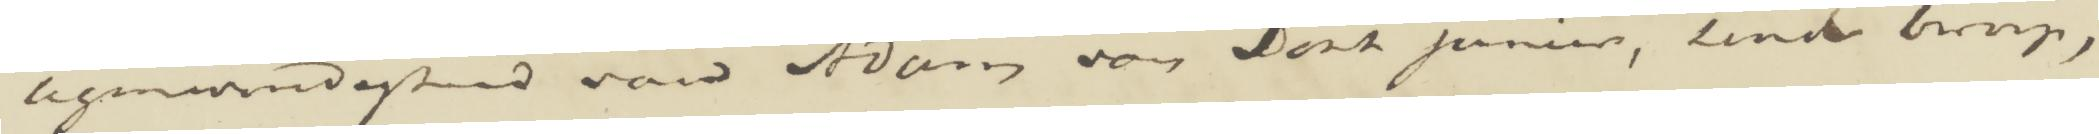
tegenwoordigheid van Adam van Dort Junior, zonder beroep,
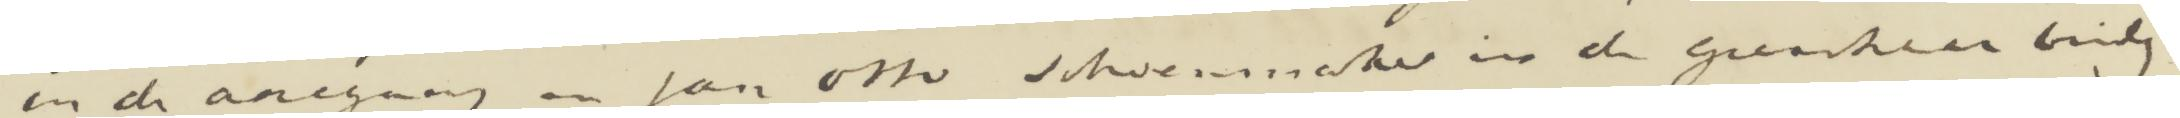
in de anegang en Jan Otto schoenmaker in de gierstraat beiden
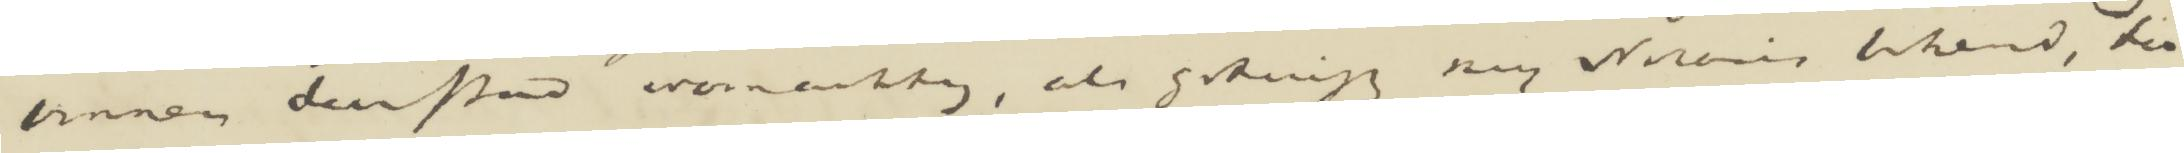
binnen deze Stad woonachtig, als getuigen mij Notaris bekend, die
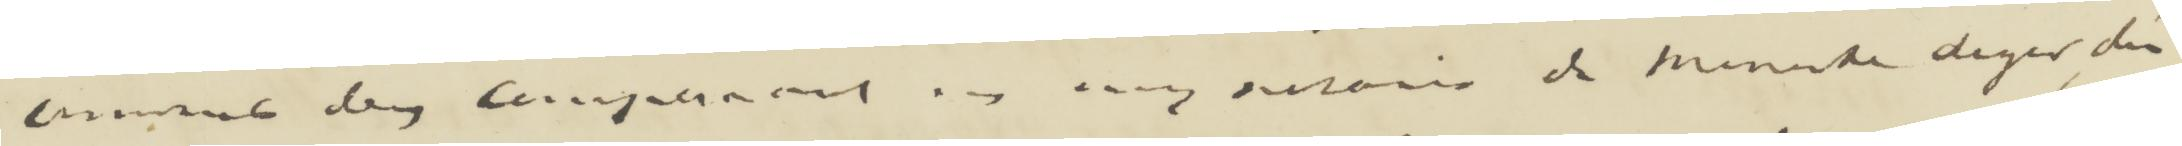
benevens den comparant en mij notaris de minute dezer, die
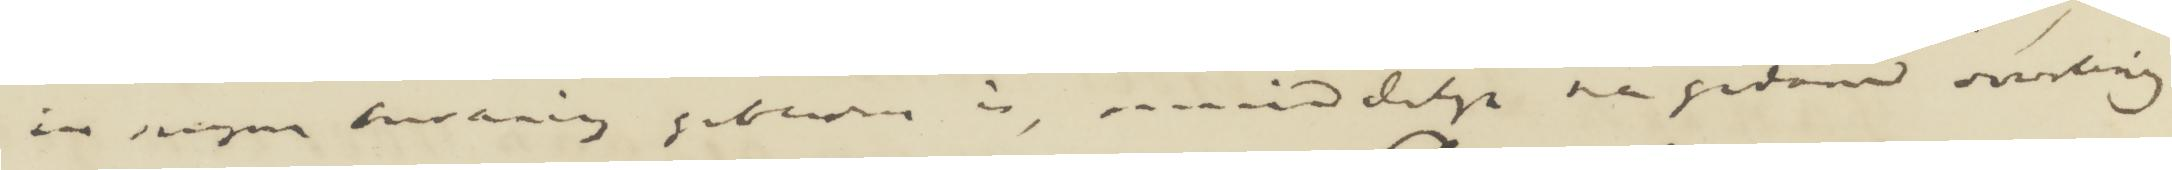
in mynen bewaring gebleven is, onmiddelyk na gedane voorlezing
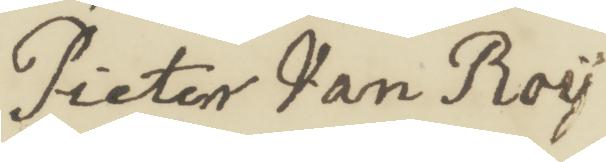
Pieter van Roij
